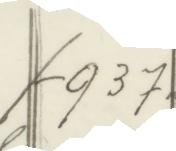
ƒ 937
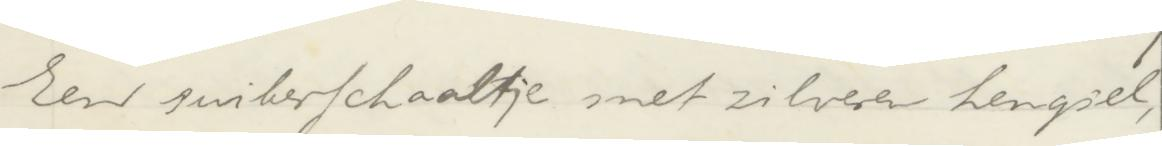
Een suikerschaaltje met zilveren hengsel,
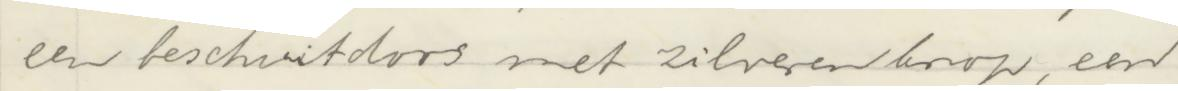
een beschuitdoos met zilveren knop, een
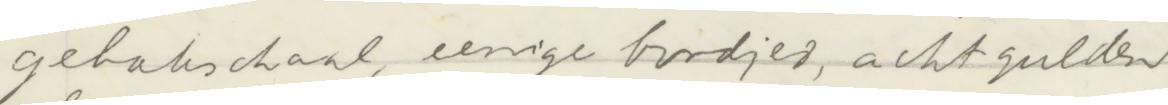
gebakschaal, eenige bordjes, acht gulden
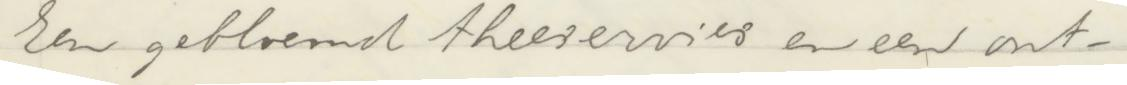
Een gebloemd theeservies en een ont-
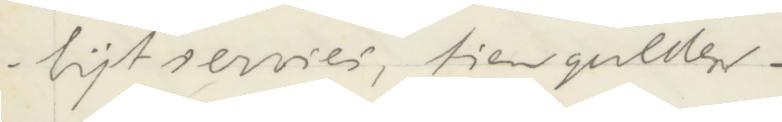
-bijt servies, tien gulden
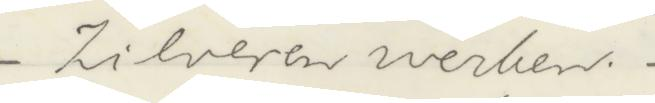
-Zilveren werken.
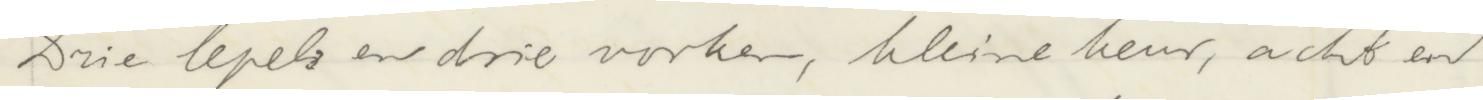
Drie lepels en drie vorken, kleine keur, acht en
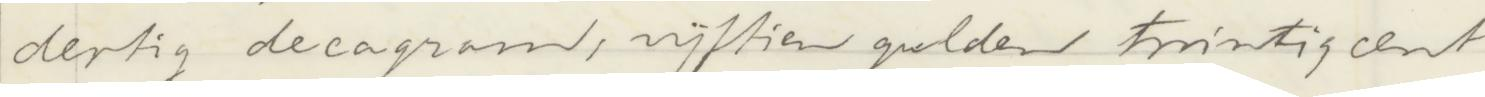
dertig decagram, vijftien gulden twintig cent
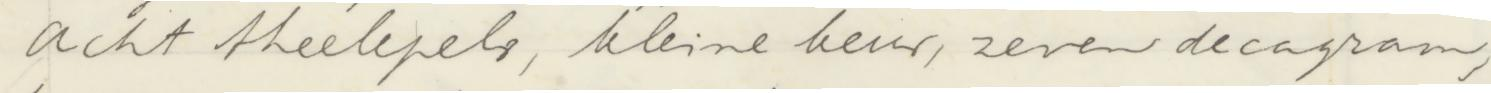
acht theelepels, kleine keur, zeven decagram,
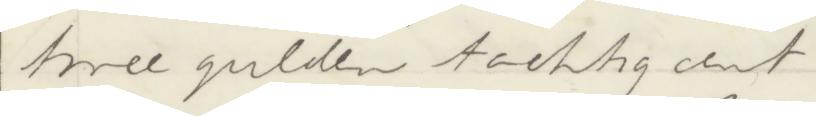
twee gulden tachtig cent
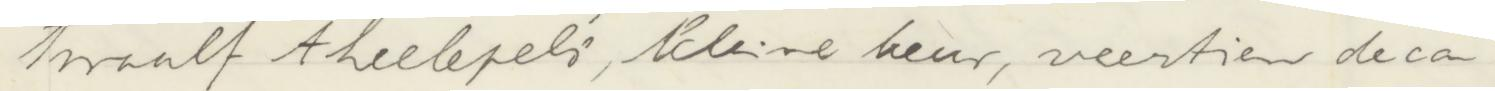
twaalf theelepels, kleine keur, veertien deca
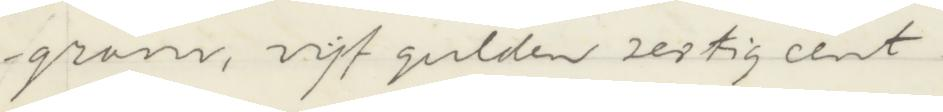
-gram, vijf gulden zestig cent
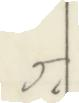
5,
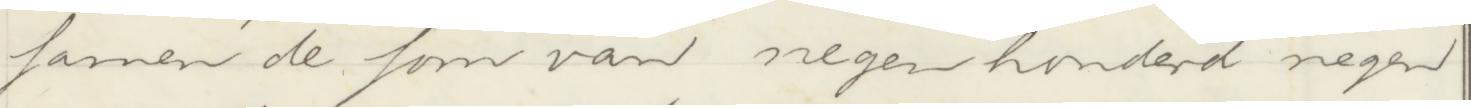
samen de som van negen honderd negen
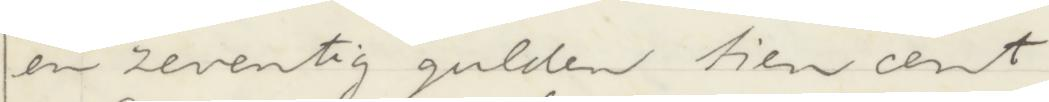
en zeventig gulden tien cent
